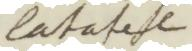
latafel
